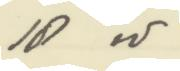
18 id
